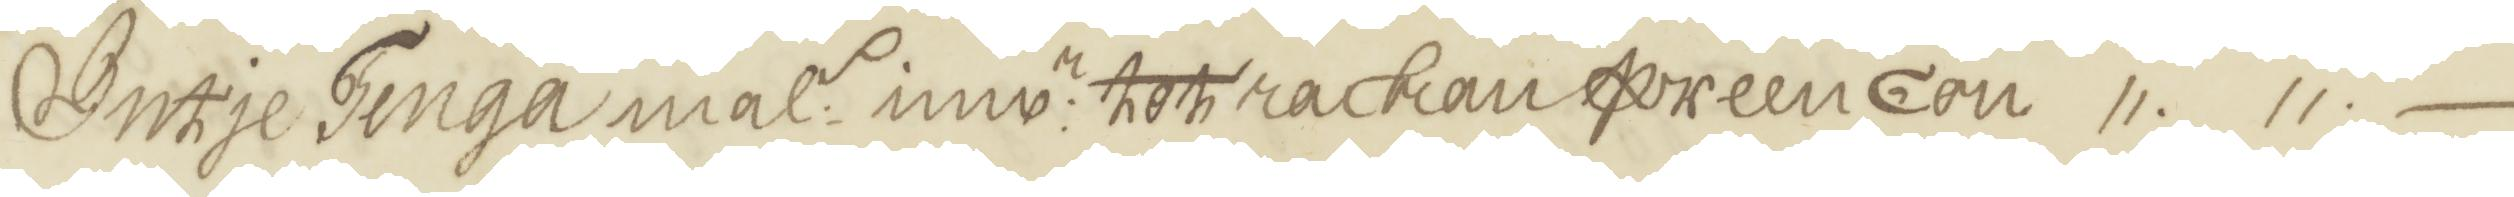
Intje Tenga mal:s inw:r tot rackan per een Con „. „. _
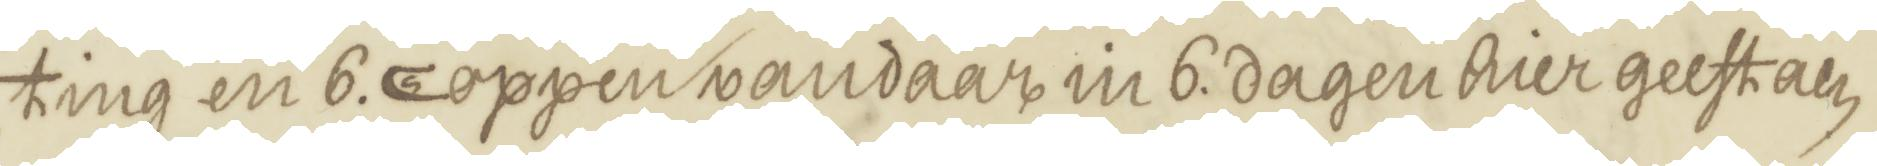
ting en 6. Coppen vandaar in 6. dagen hier geeft aen
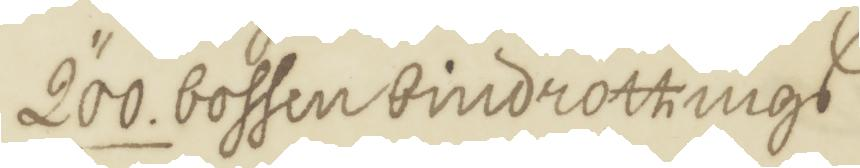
200. bossen bindrottings
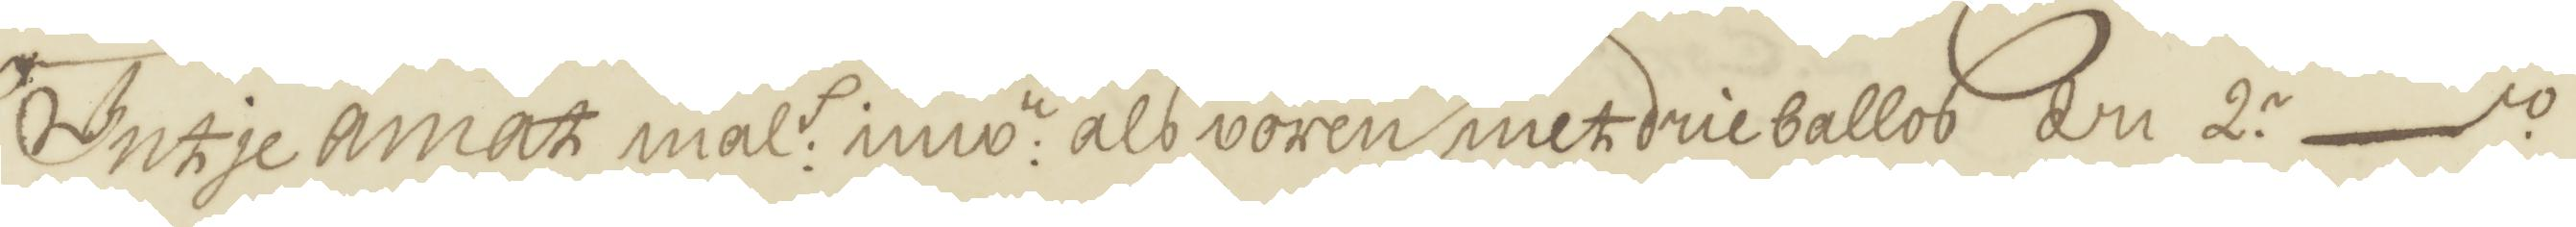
Intje amat mal:s inw:r als voren met drie ballos den 2.n _.o
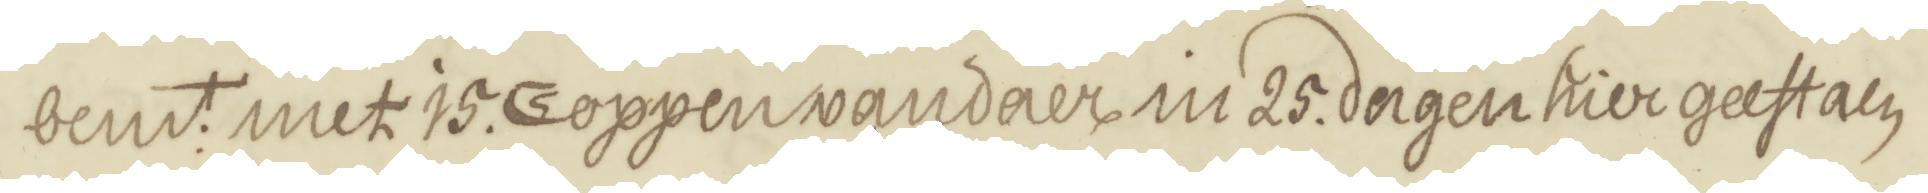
bem:t met 15. Coppen vandaer in 25. dagen hier geeft aen
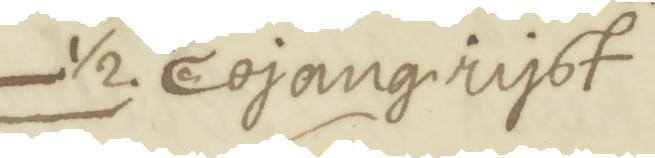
_½ Cojang rijst
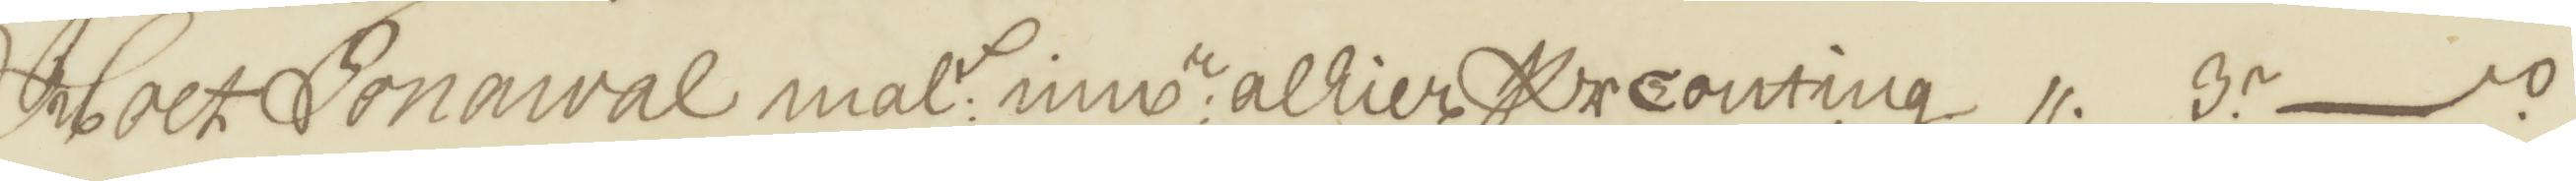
In boet Ponawal mal:s inw:r alhier per Conting „. 3.n _.o
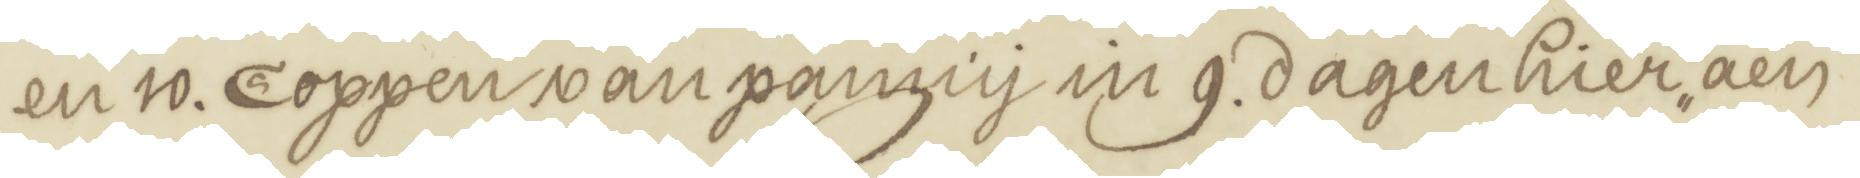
en 10. Coppen van Pannij in 9 dagen hier „ aen
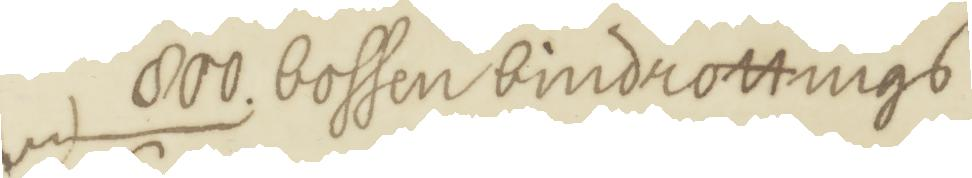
800. bossen bindrottings
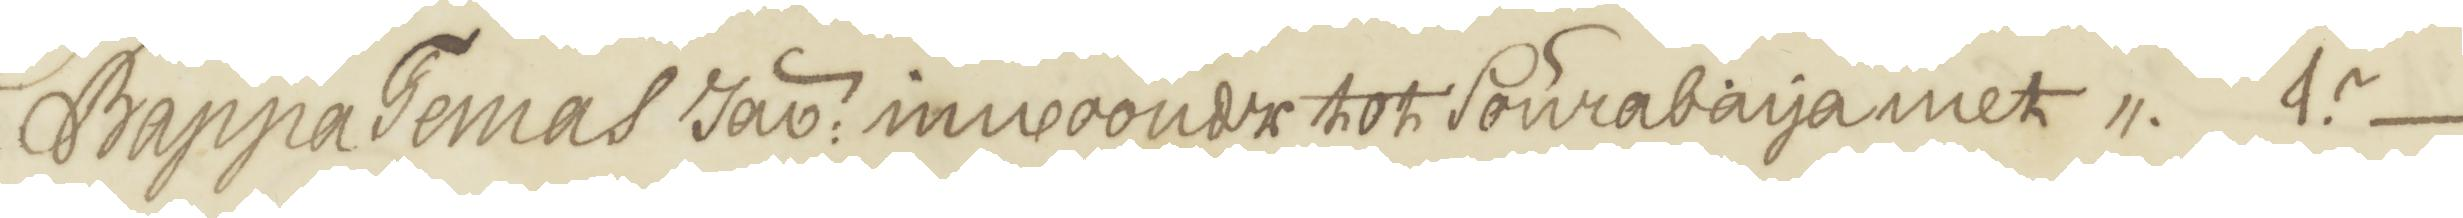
Bappa Temas Jav: inwoonder tot sourabaija met „. 4.n _
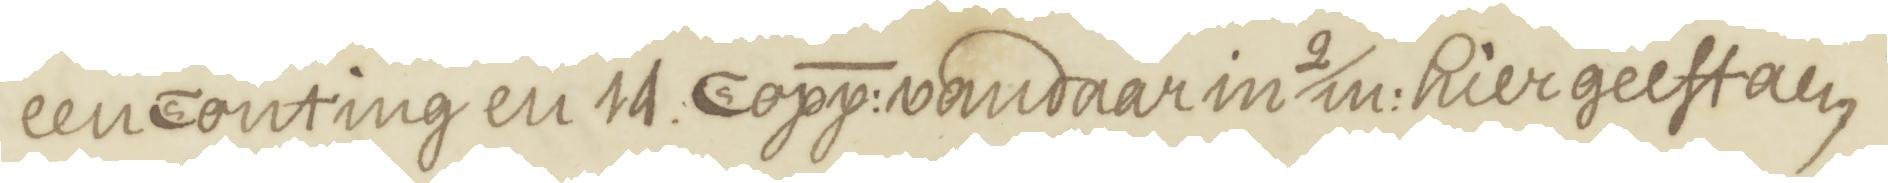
een Conting en 14. Copp: vandaar in 2/m hier geeft aen
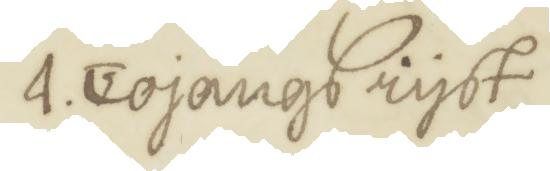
4. Cojangs rijst
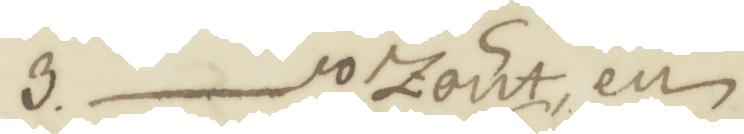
3. _.o zout, en
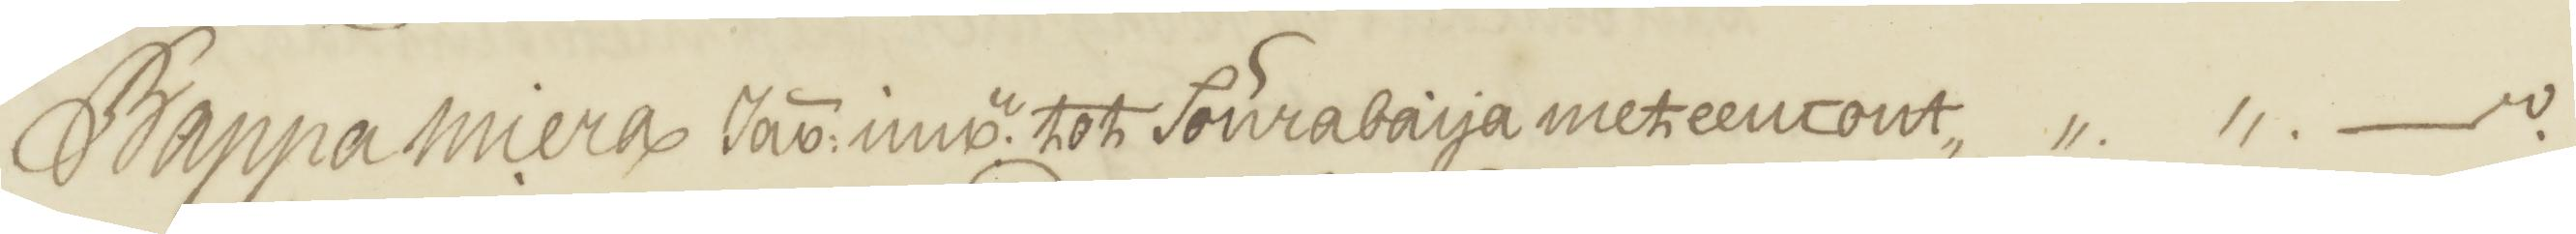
Bappa miera Jav: inw:r tot sourabaija met een Cont„ „. „. _.o
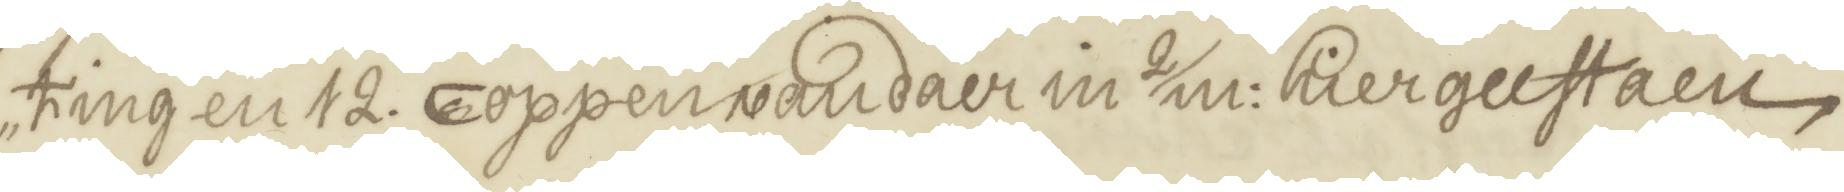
ting en 12. Coppen van daer in 2/m: hier geeft aen
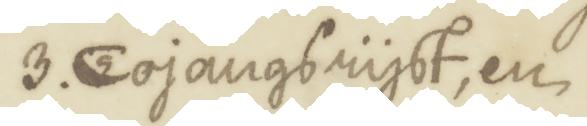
3. Cojangs rijst, en
